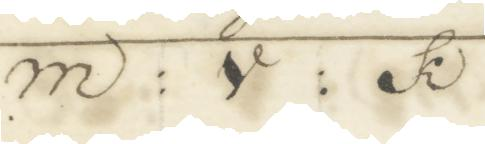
m : v : k
